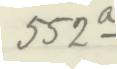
552
